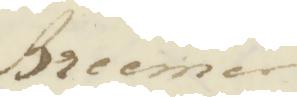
Breemer
